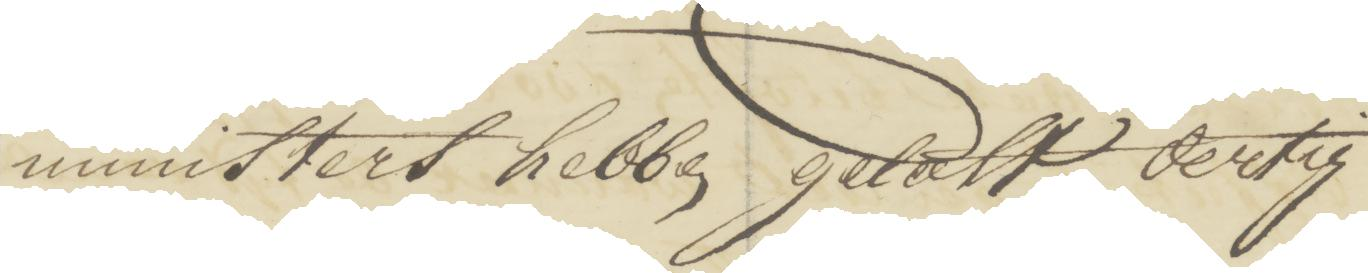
ministers hebben gelast dertig
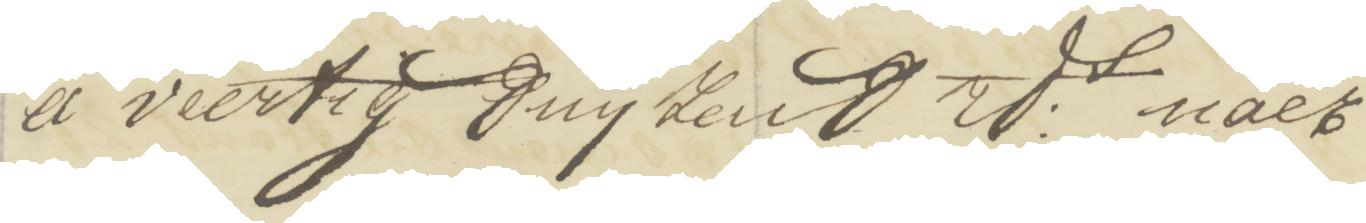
á veertig duijzend rd:s naer
